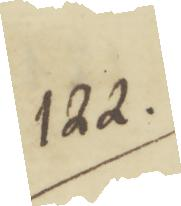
122.
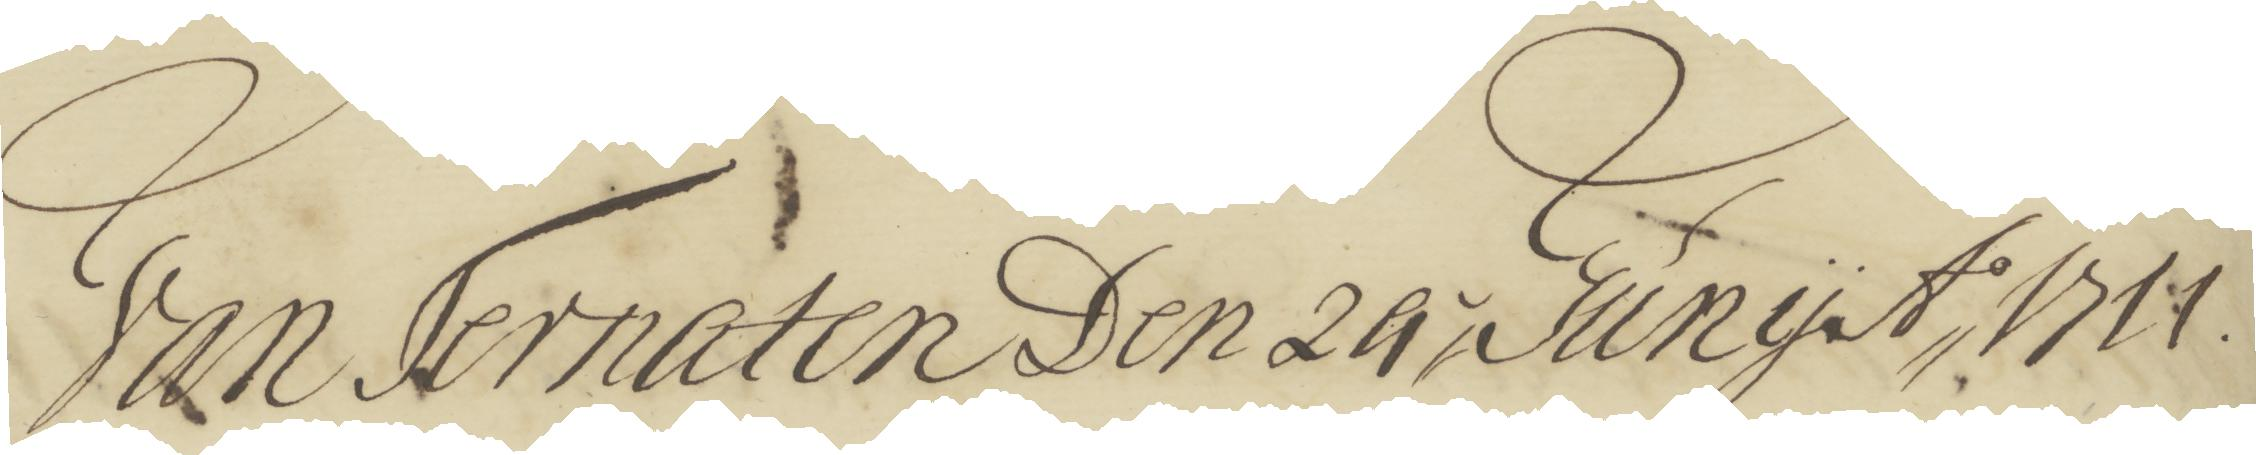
Van Ternaten Den 24„' Iunij A„o 1711.
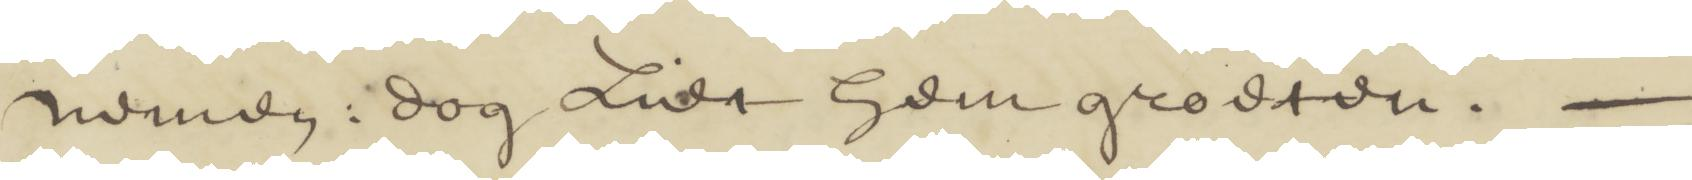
nemen: dog liet hem groeten. —
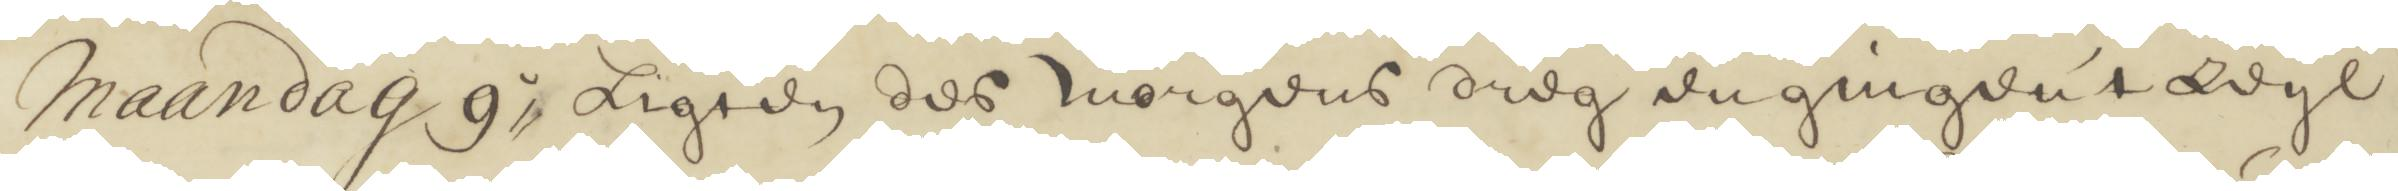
Maandag 9„' ligten des morgens dreg en gingen 't zeijl
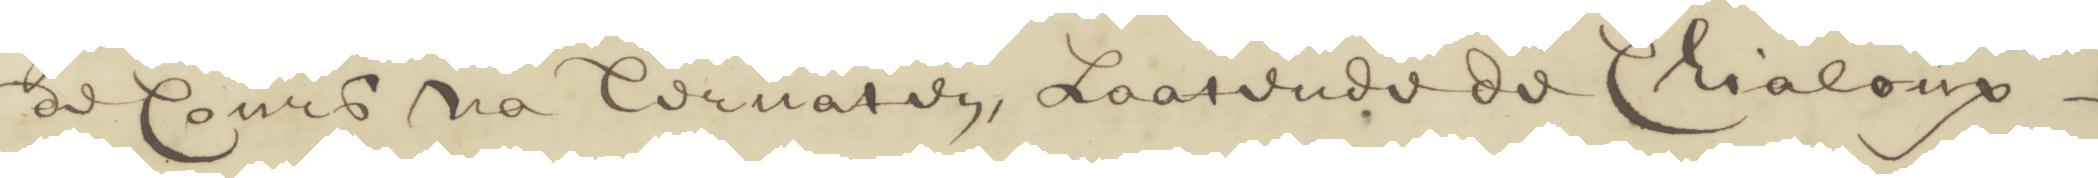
de Cours na Ternaten, laatende de Chialoup
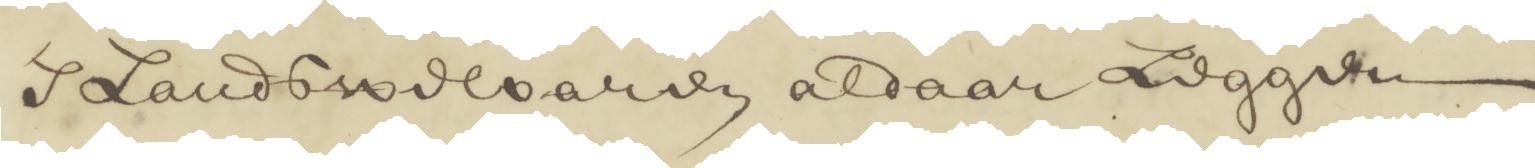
's landswelvaren aldaar leggen
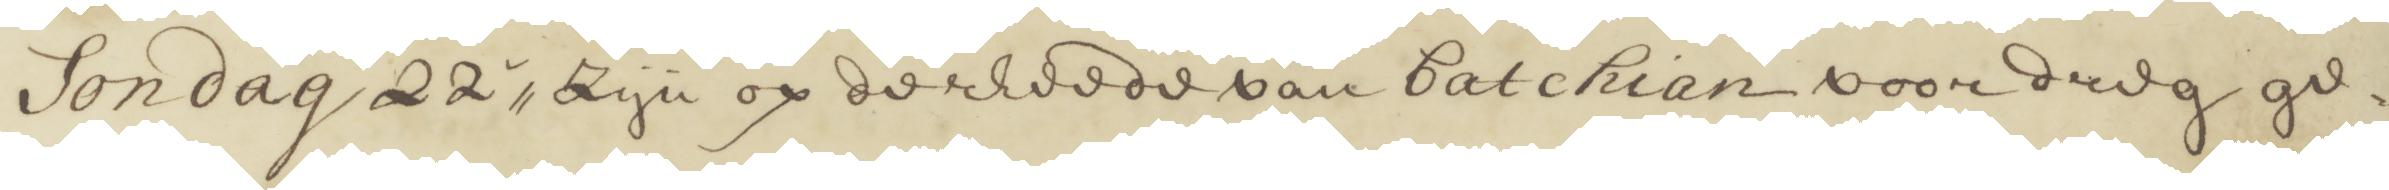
sondag 22„' zijn op de rheede van batchian voor dreg ge„
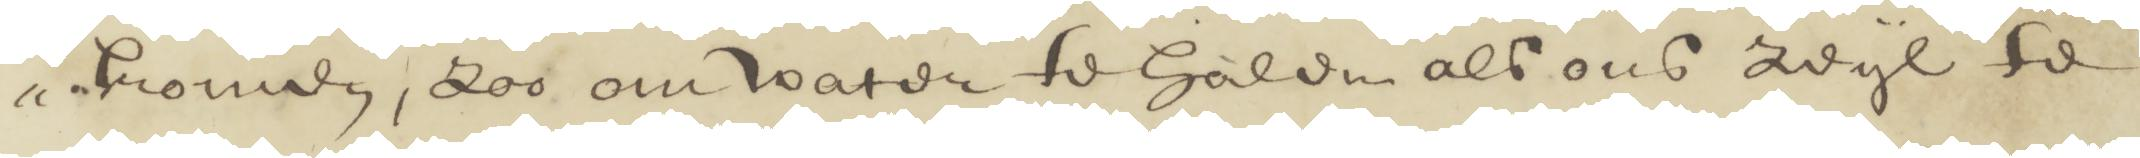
„ „komen, zoo om water te halen als ons zeijl te
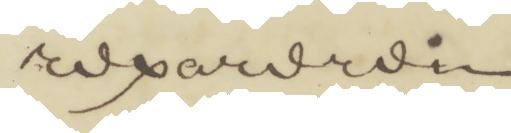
repareren
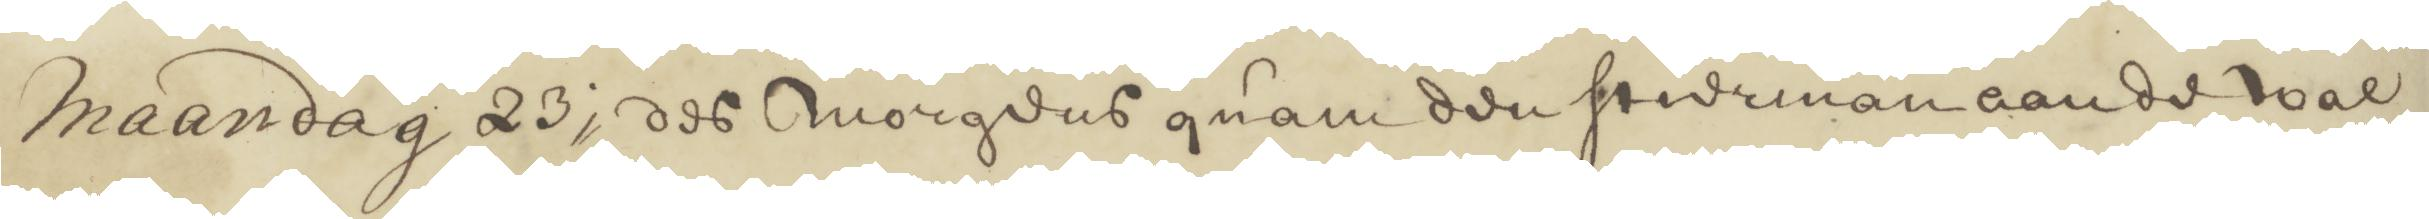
maandag 23„' des morgens quam den stierman aan de wal
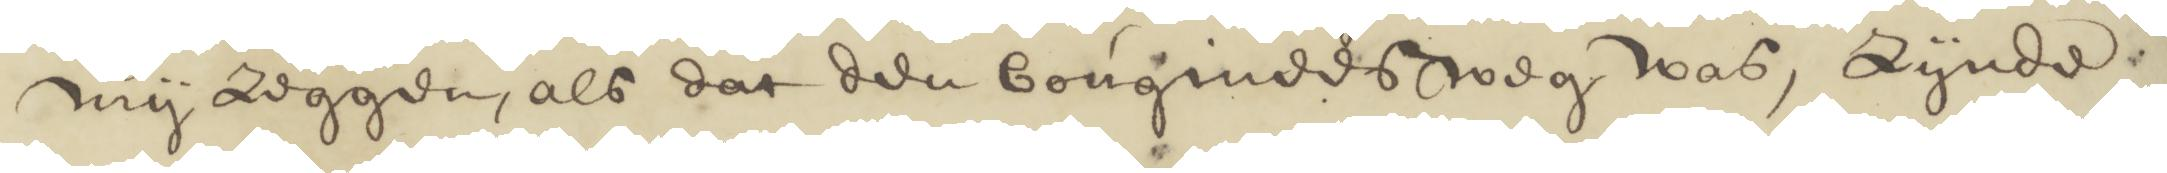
mij zeggen, als dat den bouginees weg was, zijnde
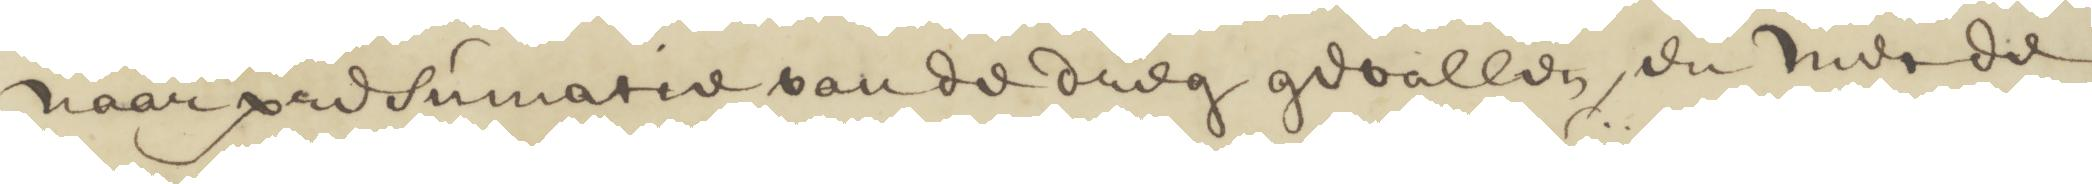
naar presumatie van de dreg gevallen, en met de
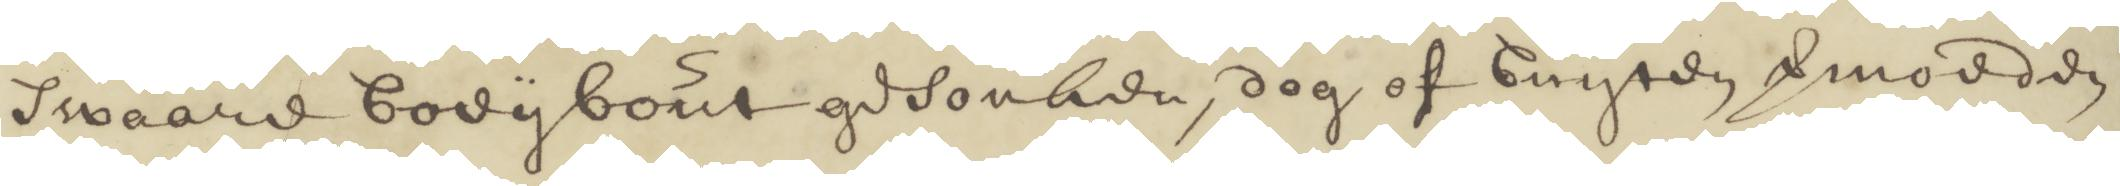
swaare boeijbout gesonken, dog of buijten vermoeden
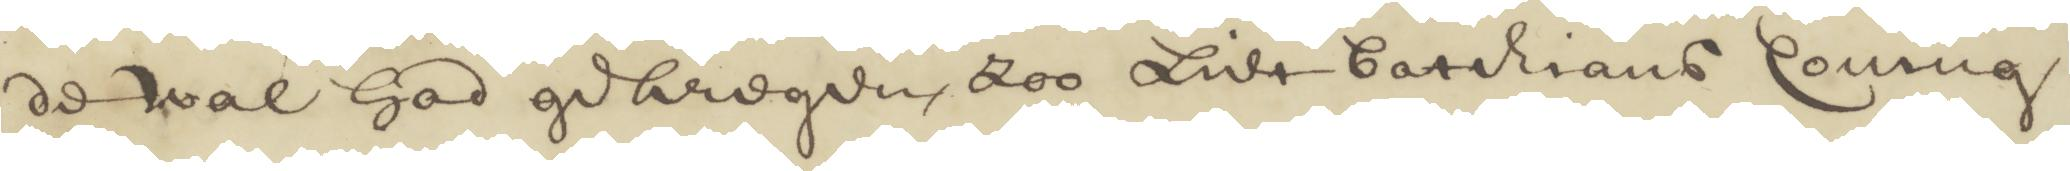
de wal had gekregen, zoo liet batchians Coning
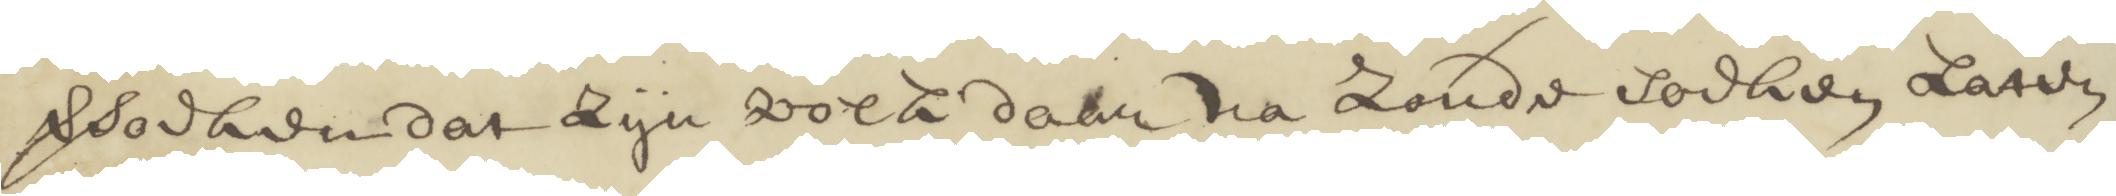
versoeken dat zijn volk daar na zoude soeken laten
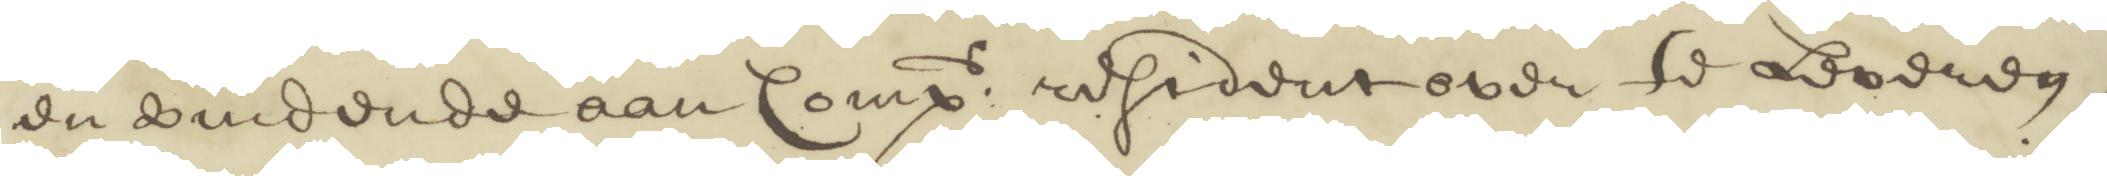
en vindende aan Comp.s resident over te leveren
